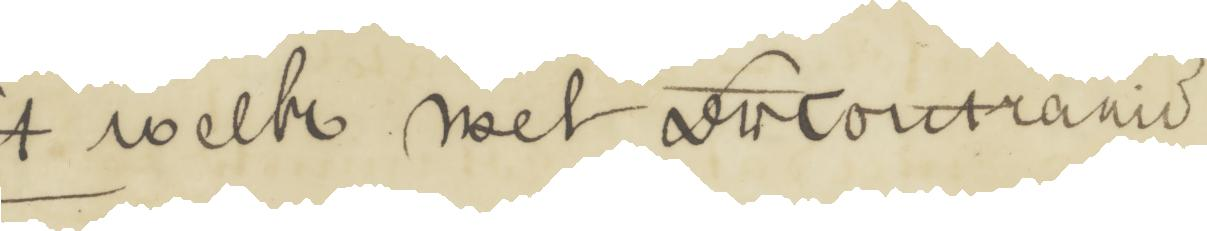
’t welk wel wel tercontrarie
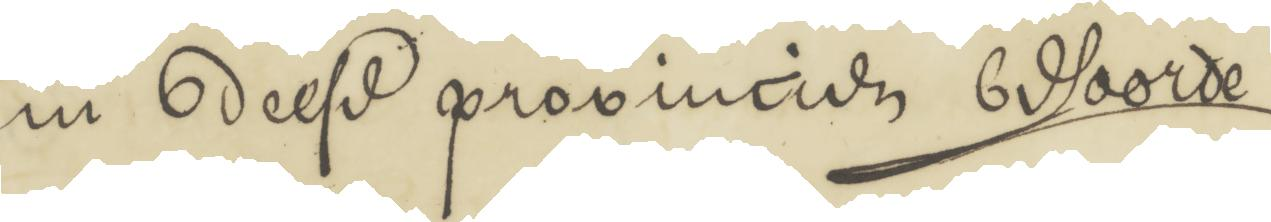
in deese provincien behoorde
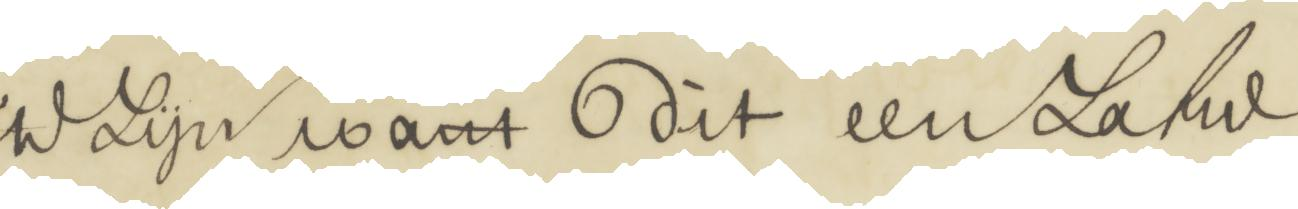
te zijn want dit een zake
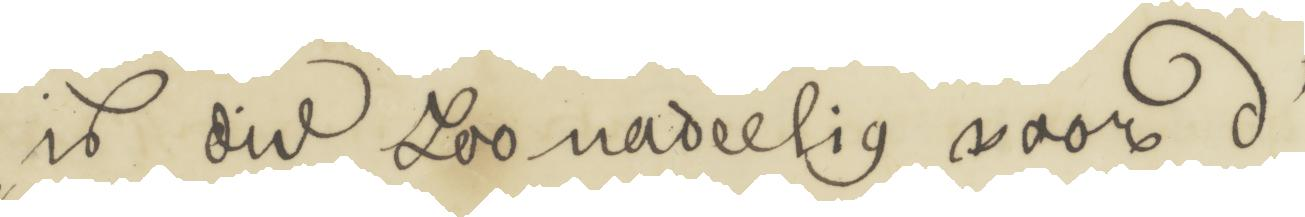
is die zoo nadeelig voor d’
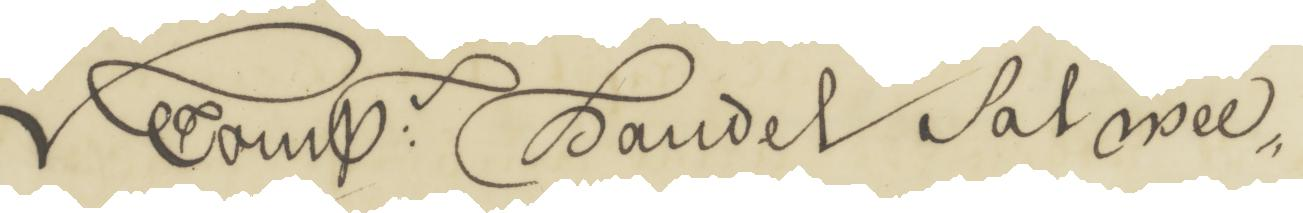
EComp:s handel sal wee„
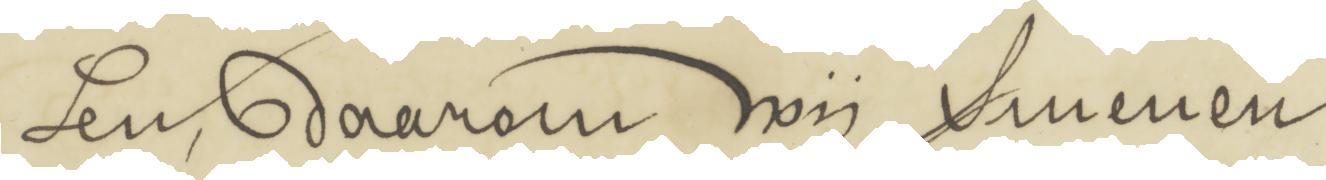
sen, daarom wij vermenen
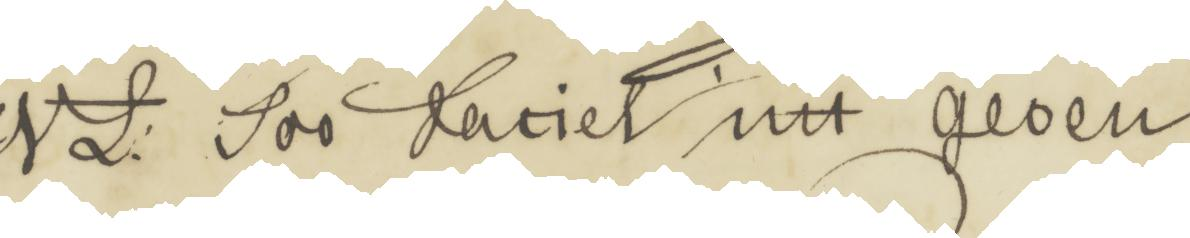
UE: soo faciel in't geven
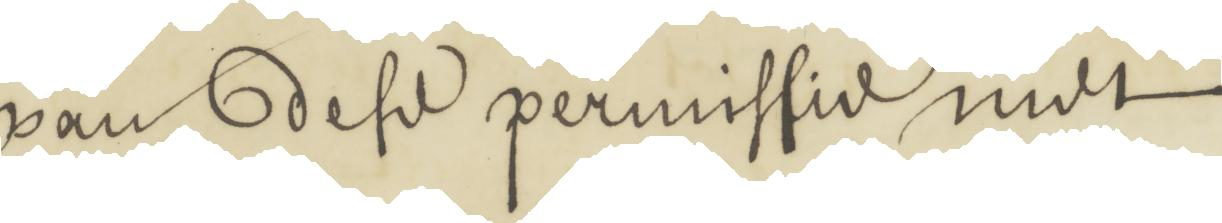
van dese permissie niet
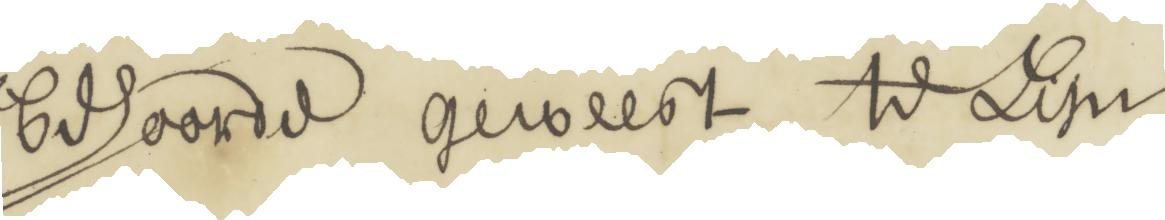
behoorde geweest te zijn,
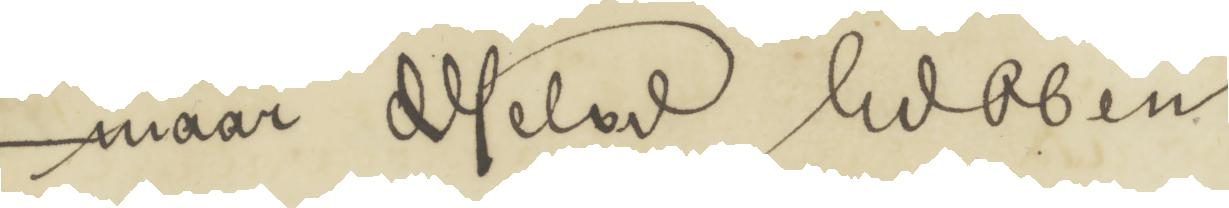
maar deselve hebben
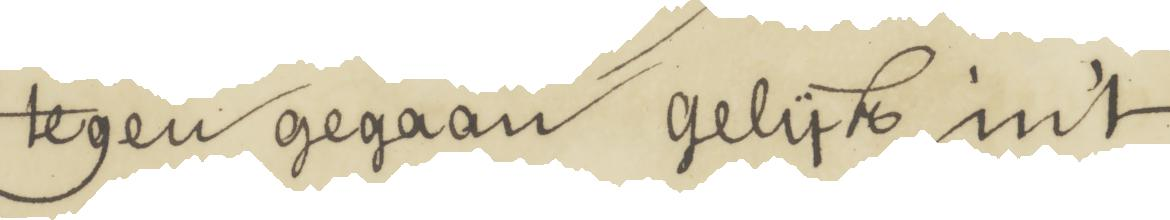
tegen gegaan gelijk in’t
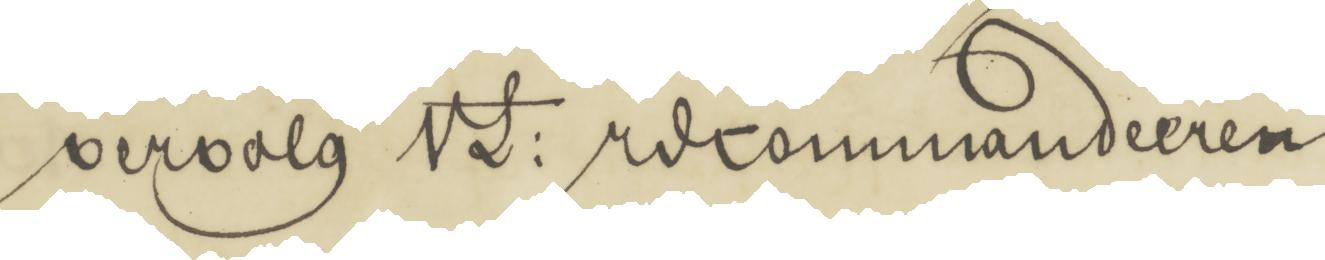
vervolg UE: recommandeeren
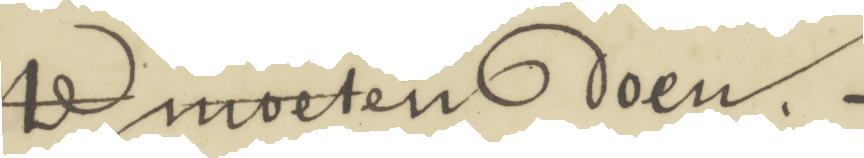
te moeten doen.—
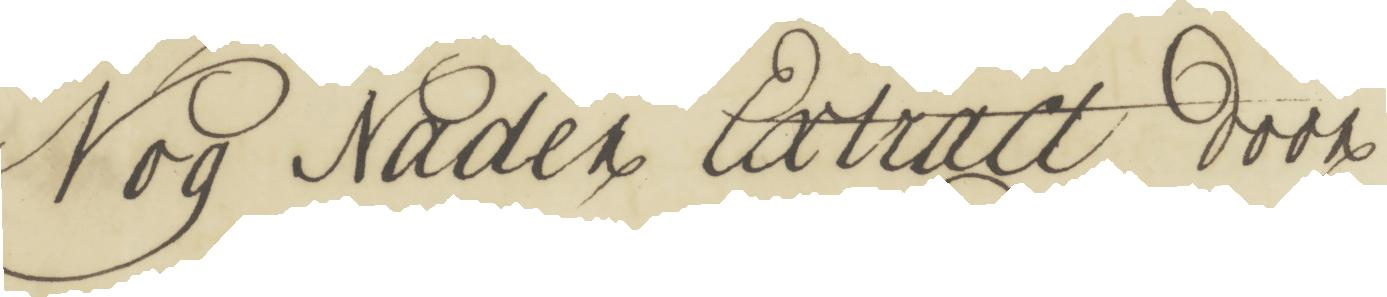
Nog Nader Extract door
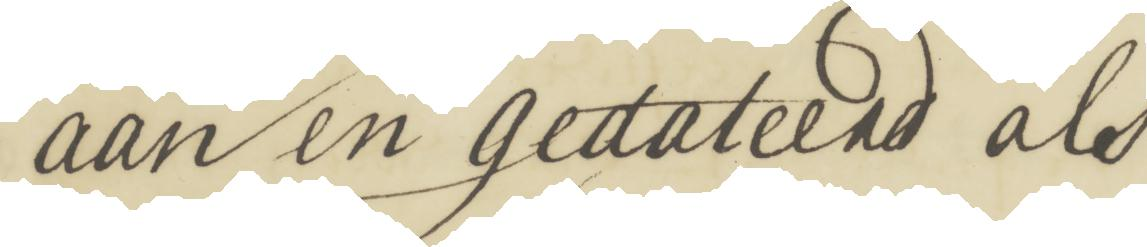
aan en gedateerd als
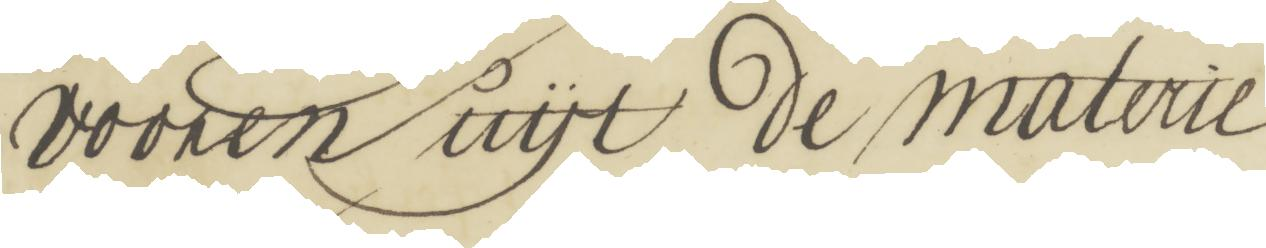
vooren uijt de materie
